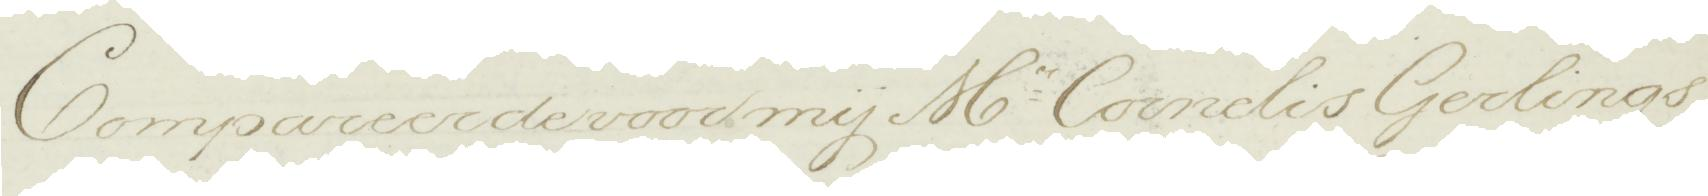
Compareerde voor mij M=r Cornelis Gerlings
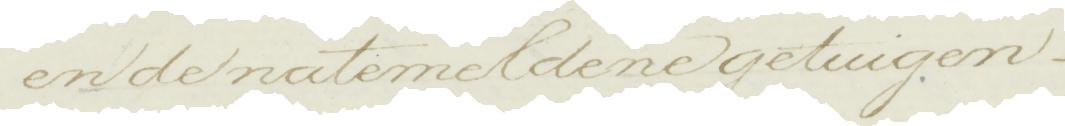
en de natemeldene getuigen
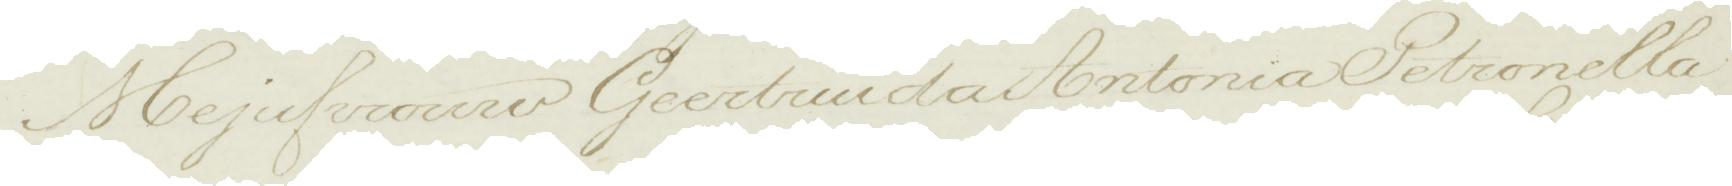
Mejufvrouw Geertruida Antonia Petronella
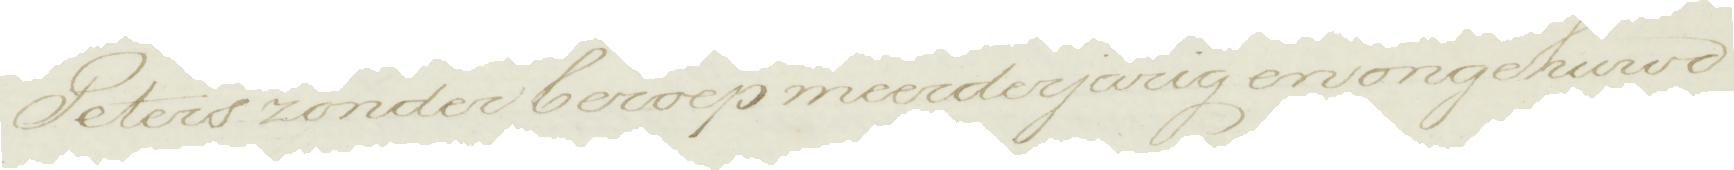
Peters zonder beroep meerderjarig en ongehuwd
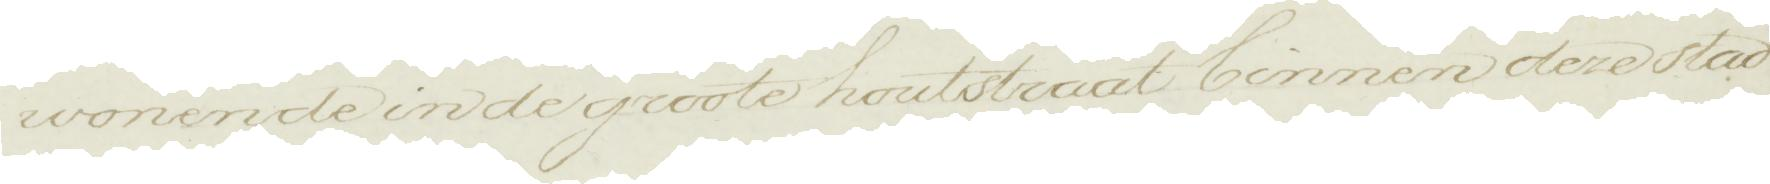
wonende in de groote houtstraat binnen deze stad
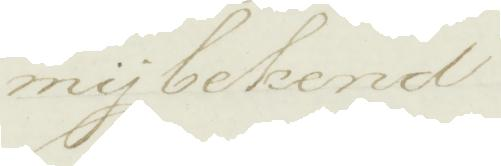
mij bekend
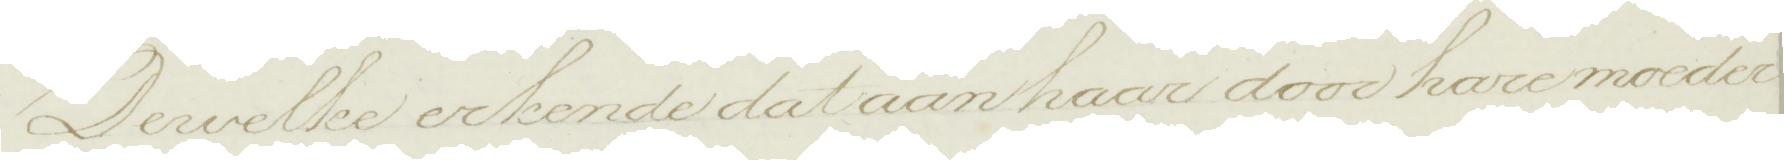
Dewelke erkende dat aan haar door hare moeder
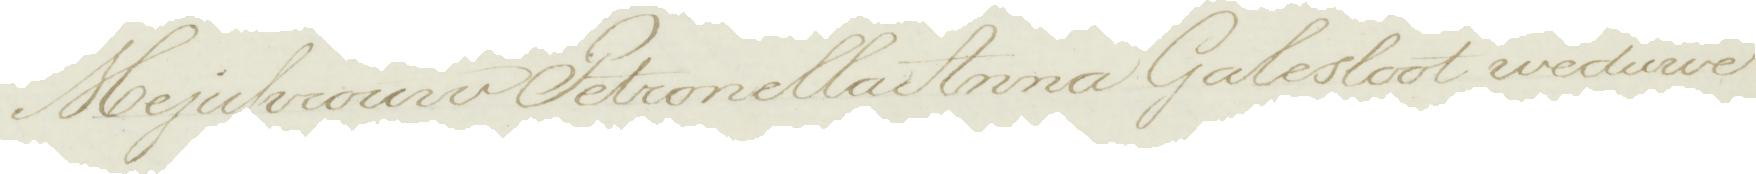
Mejufvrouw Petronella Anna Galesloot weduwe
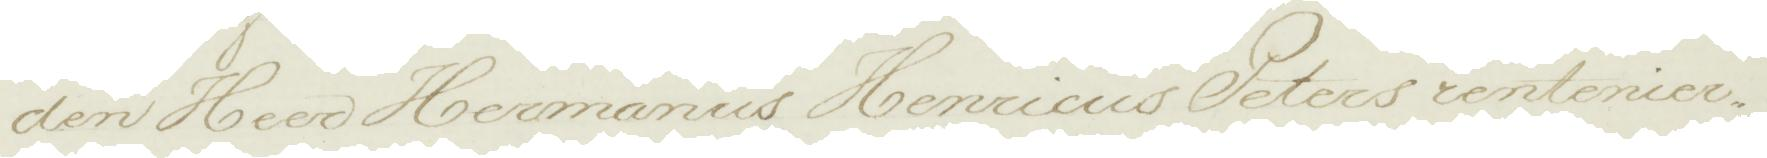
den Heer Hermanus Henricus Peters rentenier„
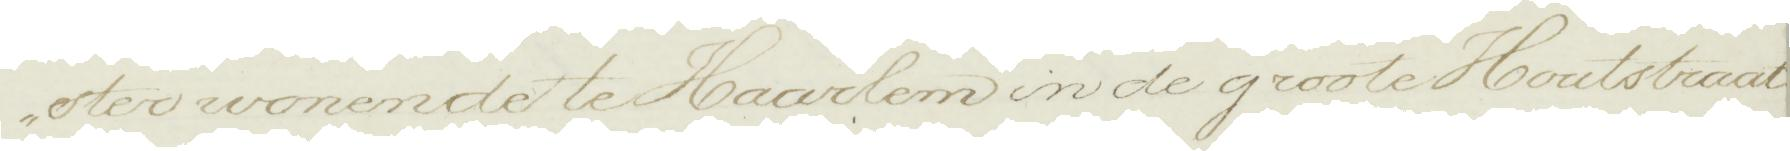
„ster wonende te Haarlem in de groote Houtstraat
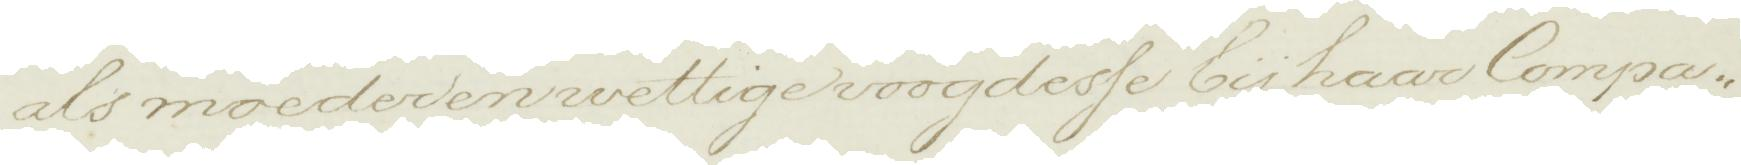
als moeder en wettige voogdesse bij haar Compa„
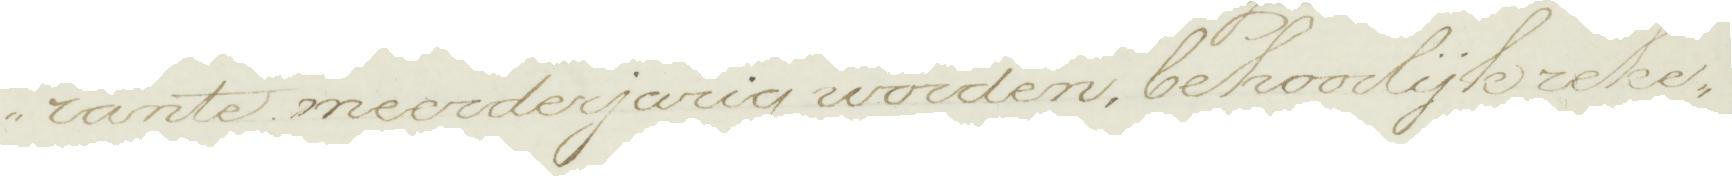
„rante meerderjarig worden, behoorlijk reke„
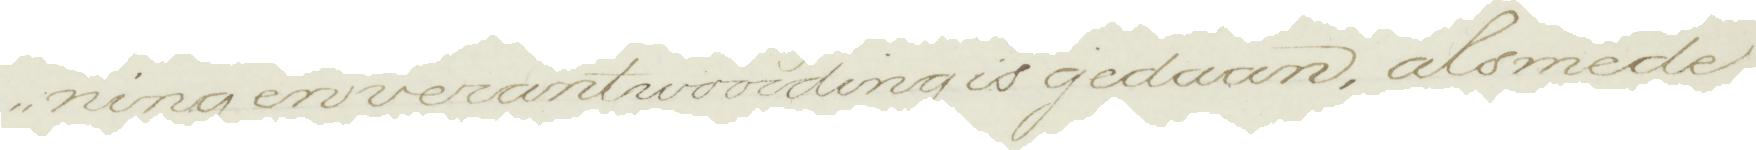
„ning en verantwoording is gedaan, alsmede
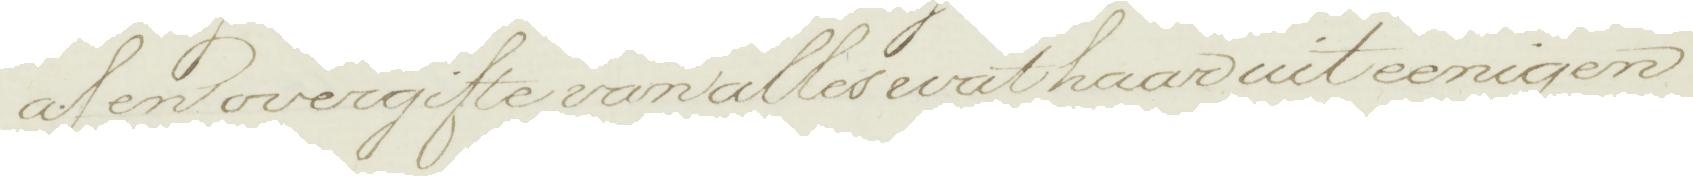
af en overgifte van alles wat haar uit eenigen
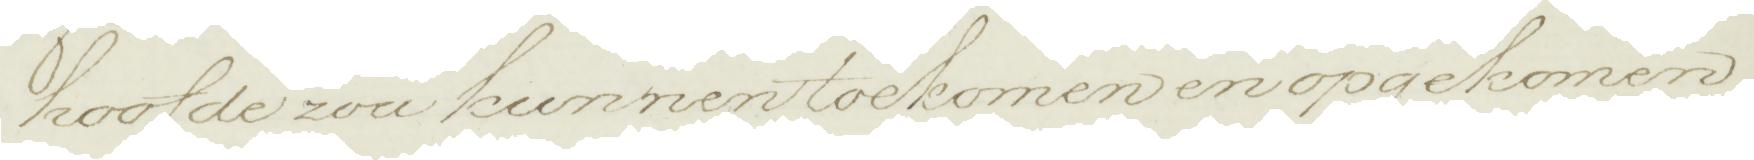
hoofde zou kunnen toekomen en opgekomen
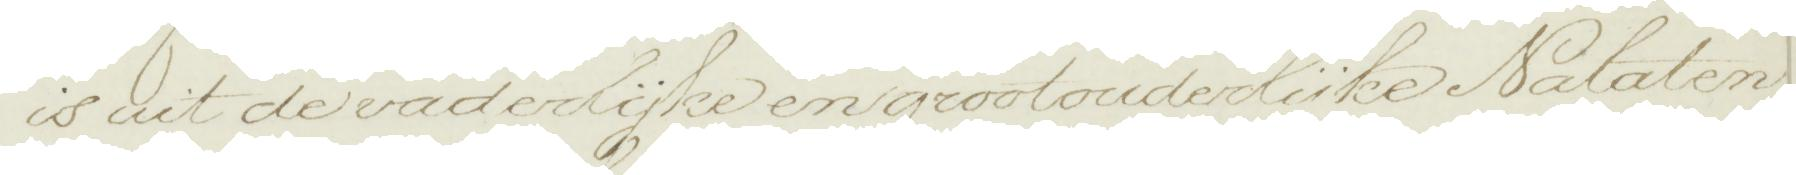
is uit de vaderlijke en grootouderlijke Nalaten
